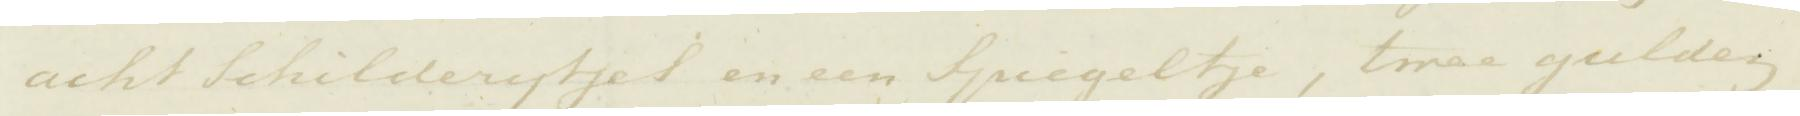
acht schilderytjes en een spiegeltje, twee gulden
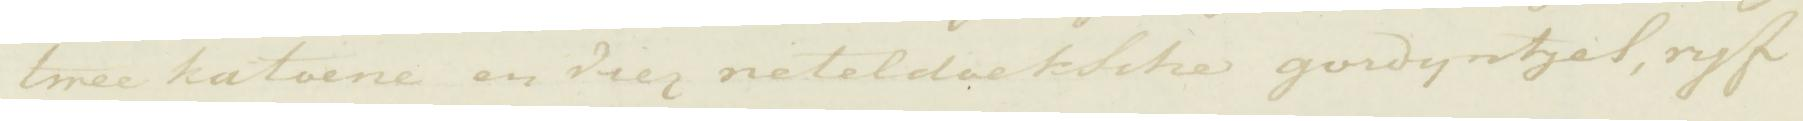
twee katoene en vier neteldoeksche gordyntjes, vyf
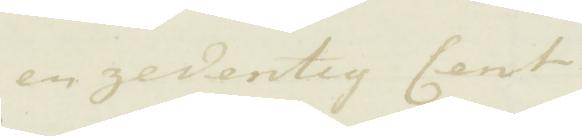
en zeventig Cent.
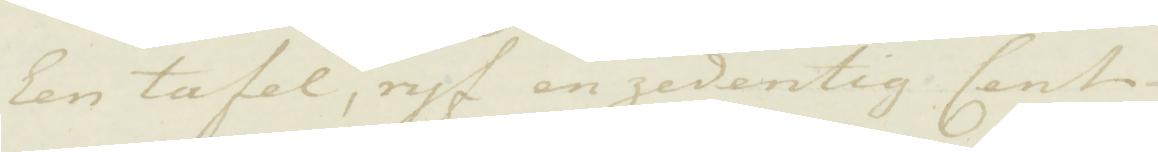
Een tafel, vyf en zeventig Cent
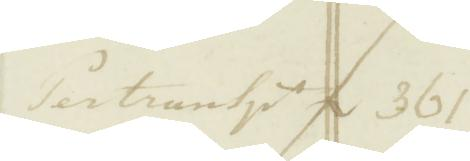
Per transpt ƒ 361
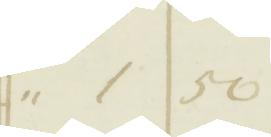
„ 1 50
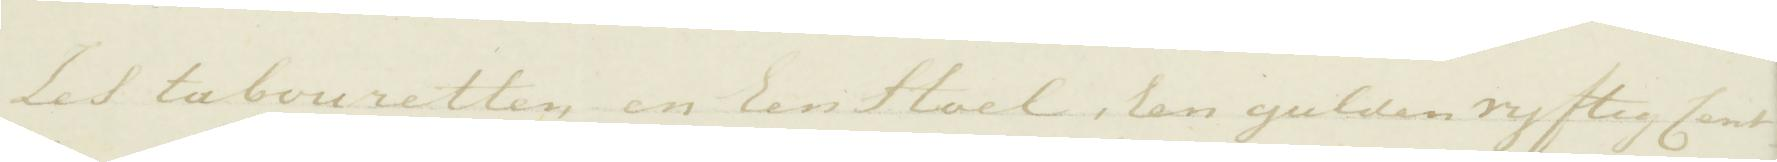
Zes tabouretten en Een stoel, Een gulden vyftig Cent
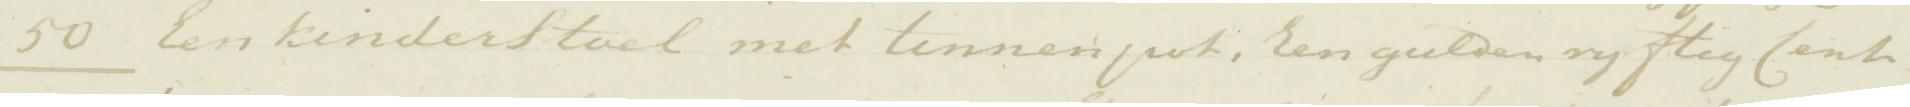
50 Een kinderstoel met tinnen pot, Een gulden vyftig Cent
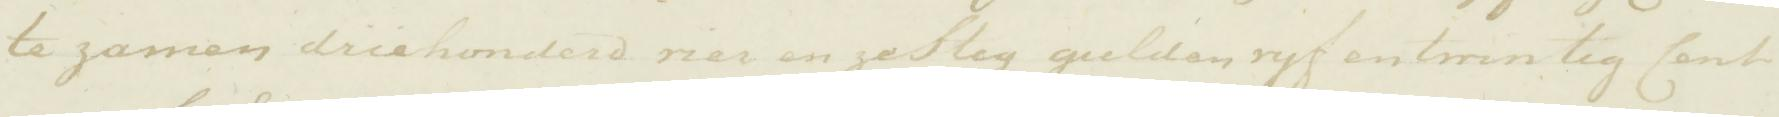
te zamen drie honderd vier en zestig gulden vyf en twintig Cent
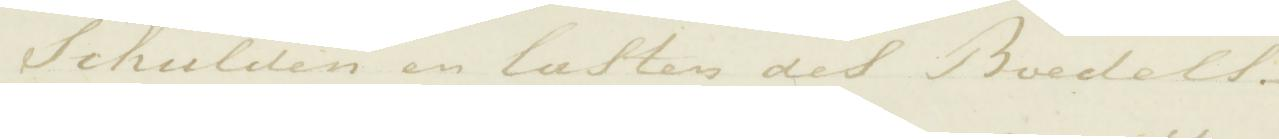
Schulden en lasten des Boedels.
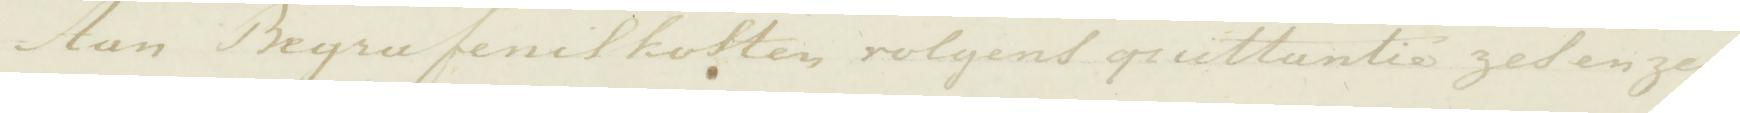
Aan Begrafeniskosten volgens quittantie zes en zes
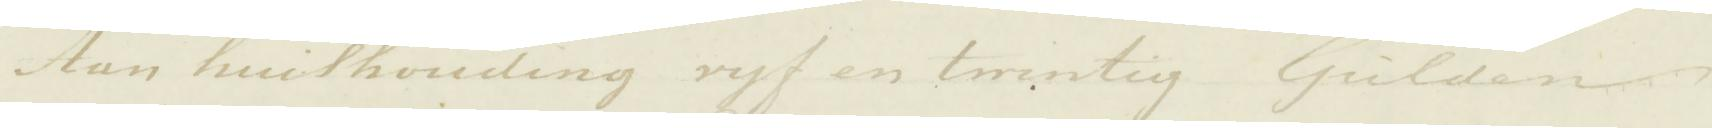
Aan huishouding vyf en twintig Gulden
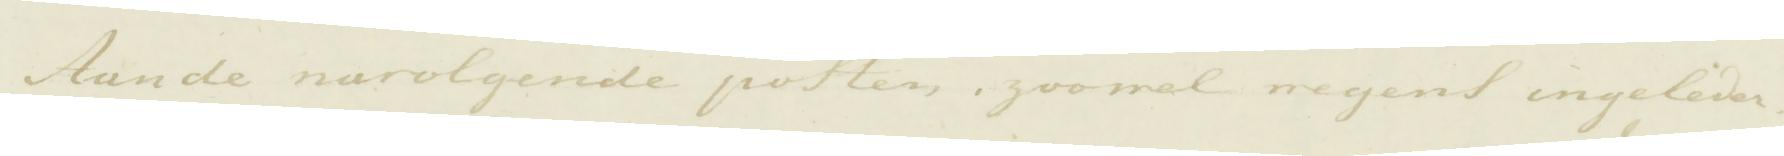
Aan de navolgende posten, zoowel wegens ingeleder
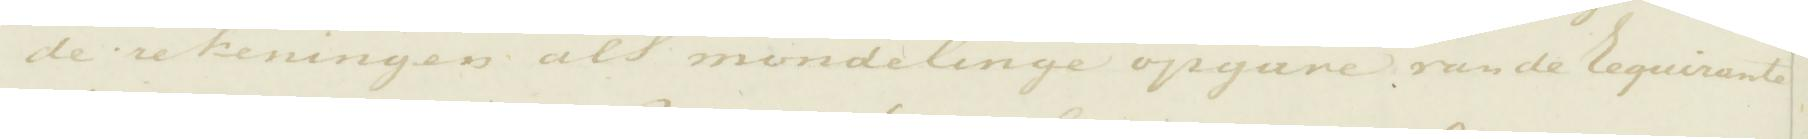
de rekeningen als mondelinge opgave van de requirante
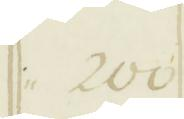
„ 200
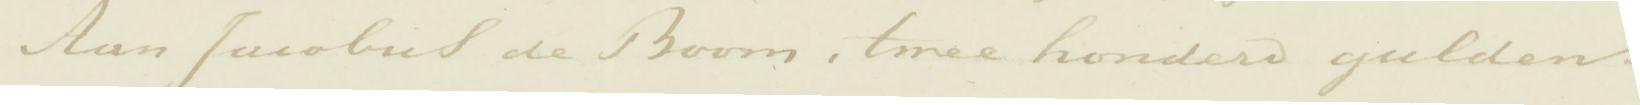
Aan Jacobus de Boom, twee honderd gulden
